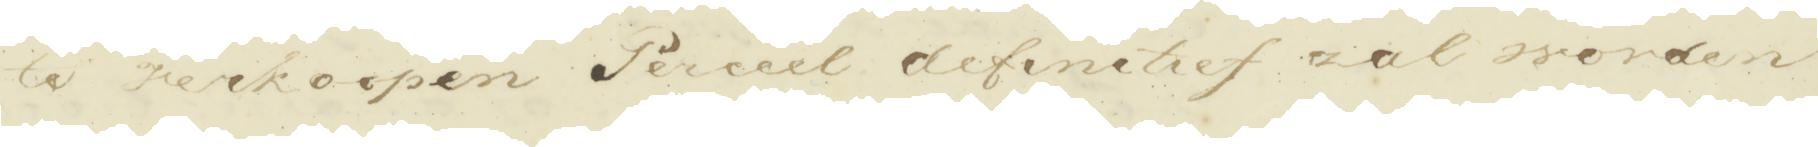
te verkoopen Perceel definitief zal worden
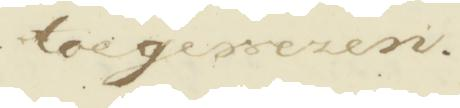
toegewezen.
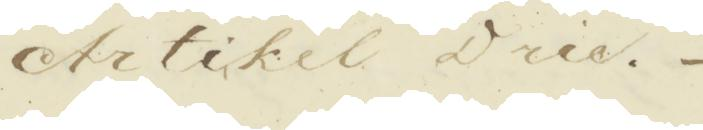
Artikel Drie. -
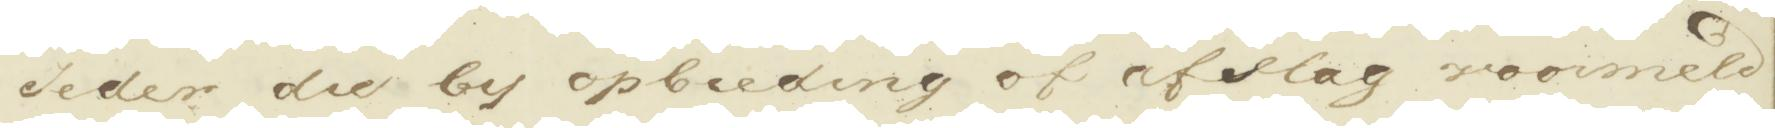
Ieder die bij opbieding of afslag voormeld
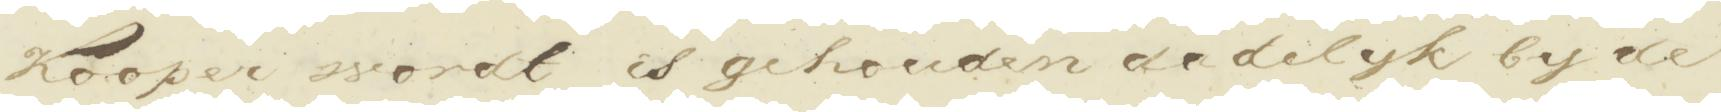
Kooper wordt is gehouden dadelijk bij de
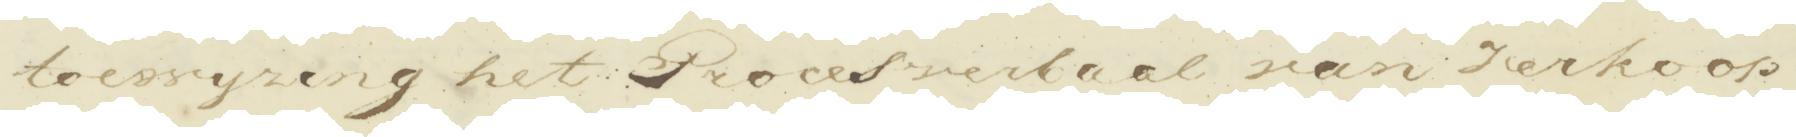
toewyzing het Procesverbaal van Verkoop
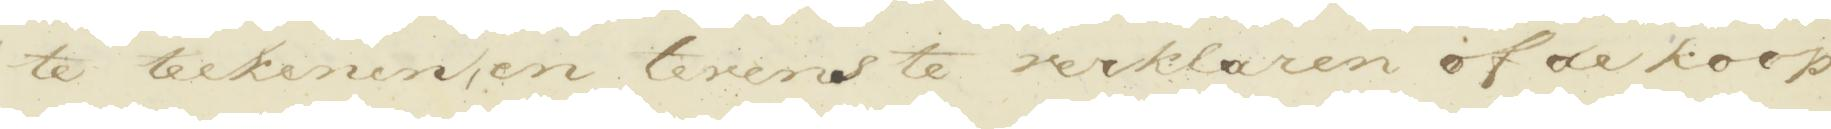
te teekenen, en tevens te verklaren of de koop
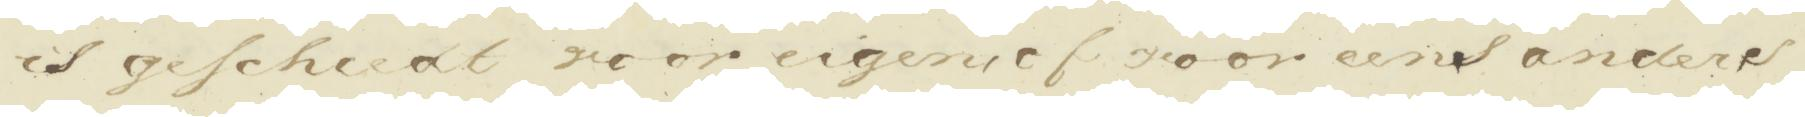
is geschiedt voor eigen, of voor eens anders
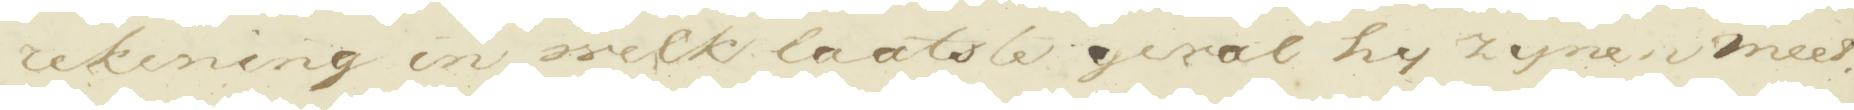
rekening in welk laatste geval hy zynen mees
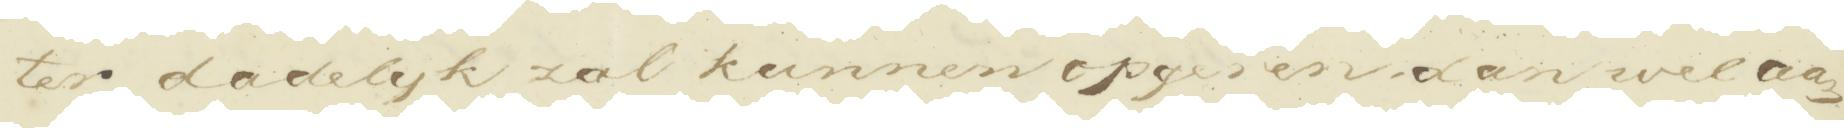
ter dadelyk zal kunnen opgeven, dan wel aan
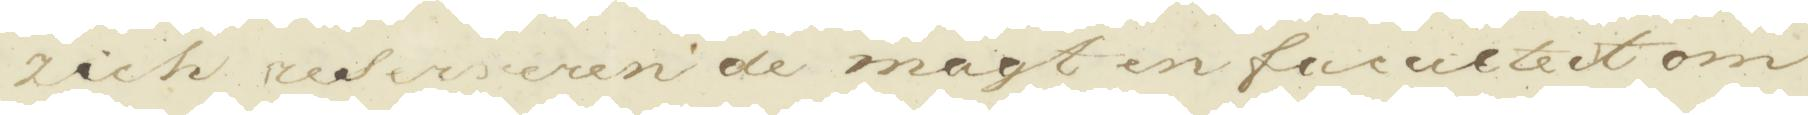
zich reserveren de magt en faculteit om
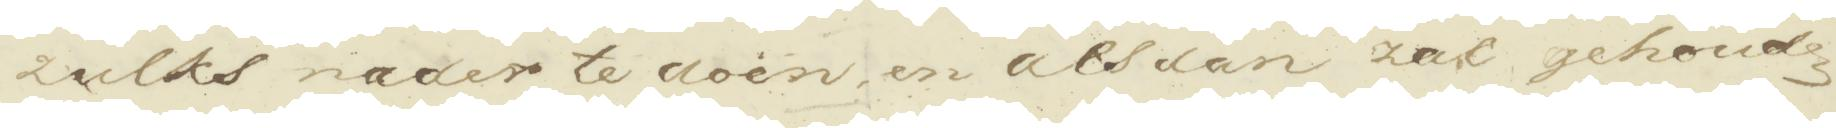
zulks nader te doen, en als dan zal gehouden
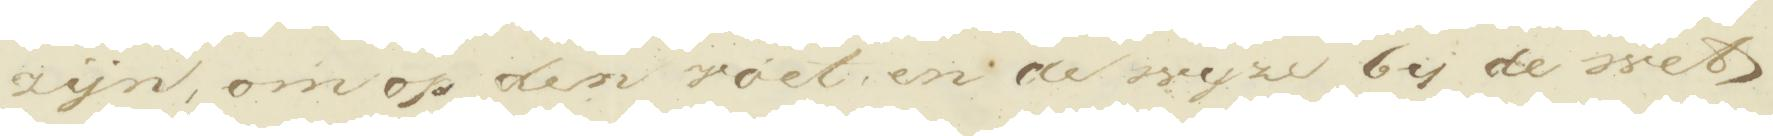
zijn, om op den voet, en de wyze bij de wet
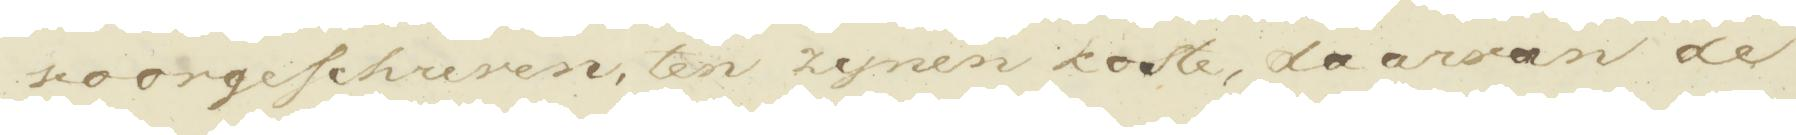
voorgeschreven, ten zynen koste, daarvan de
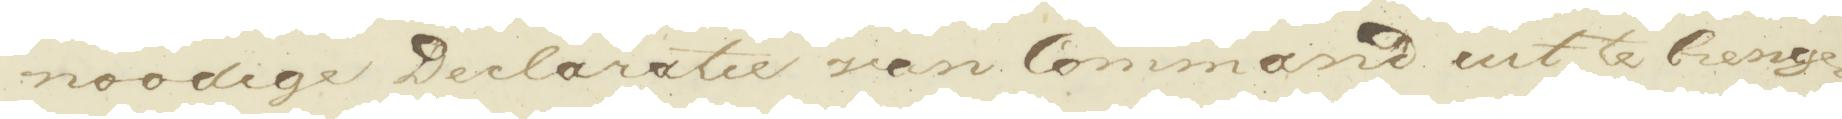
noodige Declaratie van Command uit te brengen
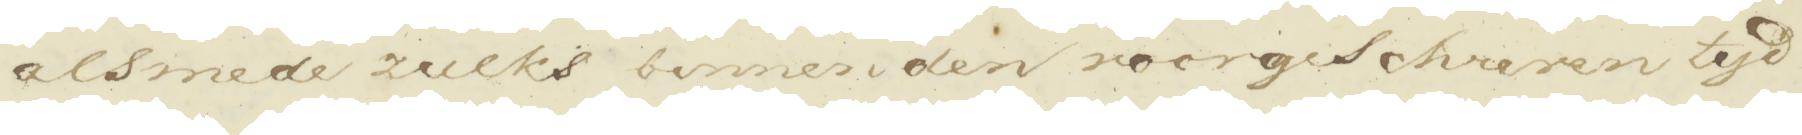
alsmede zulks binnen den voorgeschreven tyd
